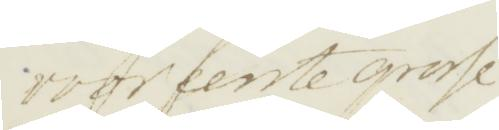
voor eene grosse
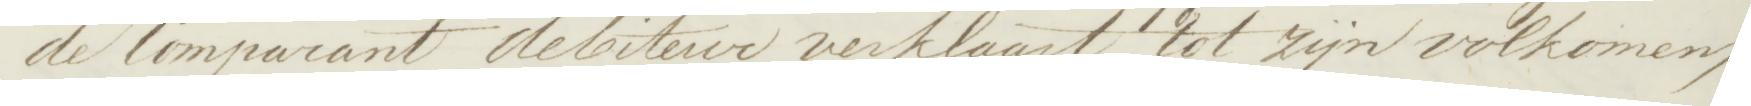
de Comparant debiteur verklaart tot zijn volkomen
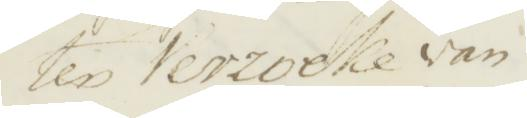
ten Verzoeke van
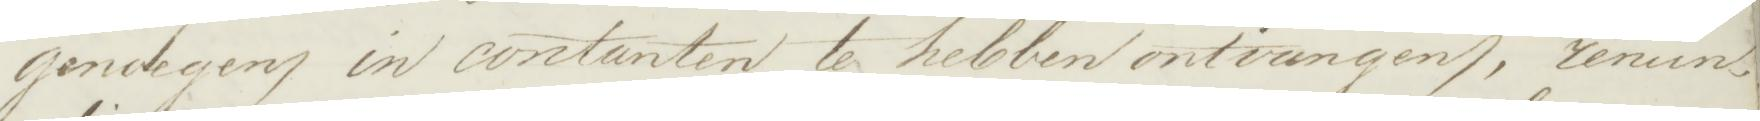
genoegen in contanten te hebben ontvangen, renun„
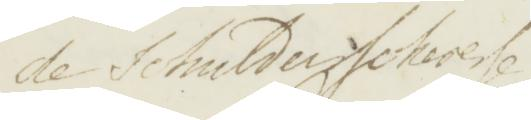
de schuldeischeresse
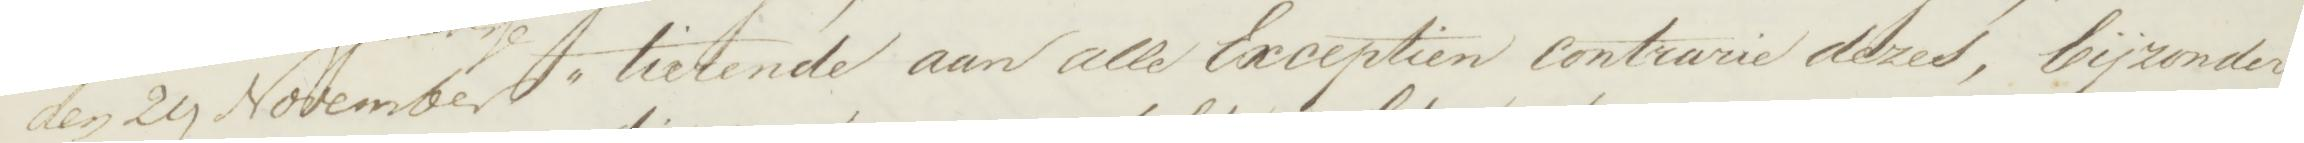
den 29 November „tierende aan alle Exceptien contrarie dezes, bijzonder
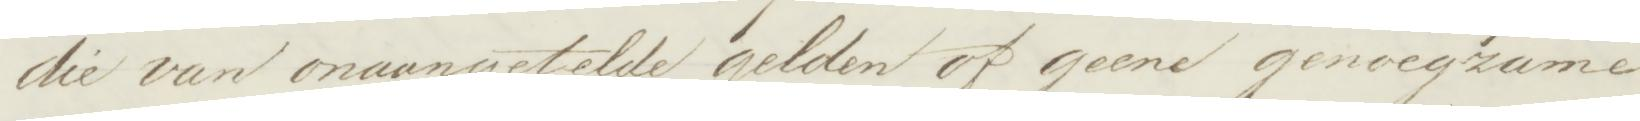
die van onaangetelde gelden of geene genoegzame
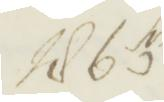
1865
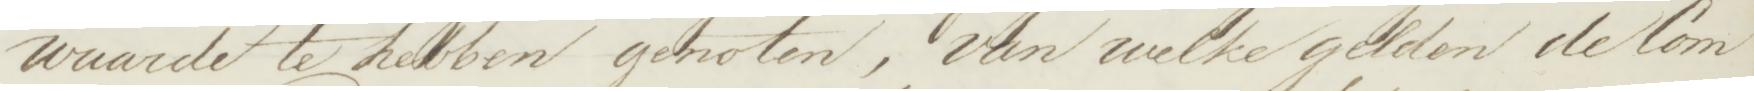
waarde te hebben genoten, van welke gelden de Com
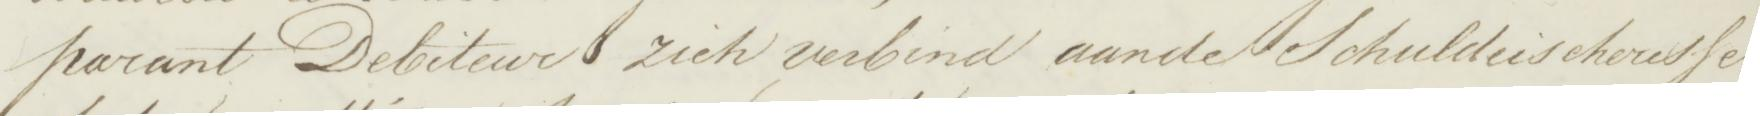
parant Debiteur zich verbind aande Schuldeischeresse
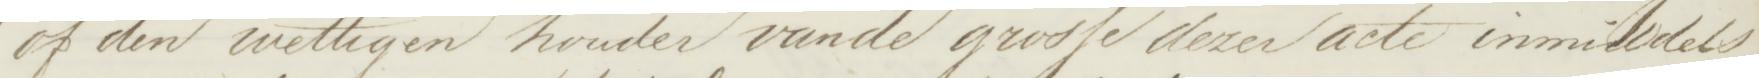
of den wettigen houder vande grosse dezer acte inmiddels
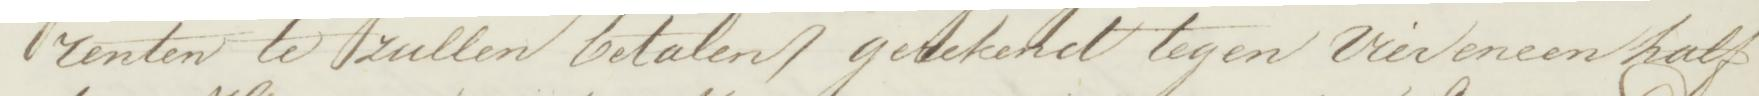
renten te zullen betalen gerekend tegen vier en een half
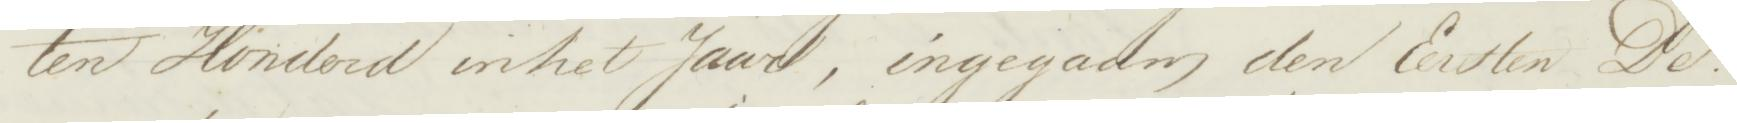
ten Honderd in het Jaar, ingegaan den Eersten De„
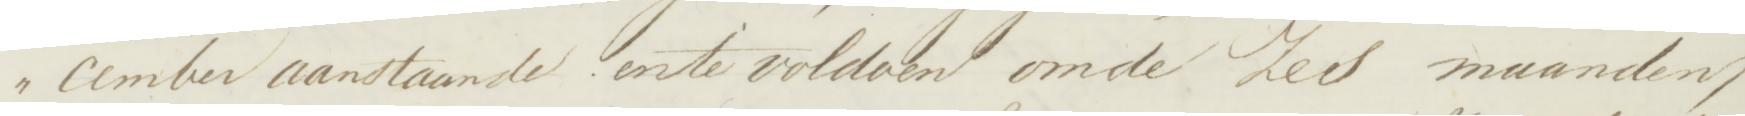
„cember aanstaande, en te voldoen om de Zes maanden,
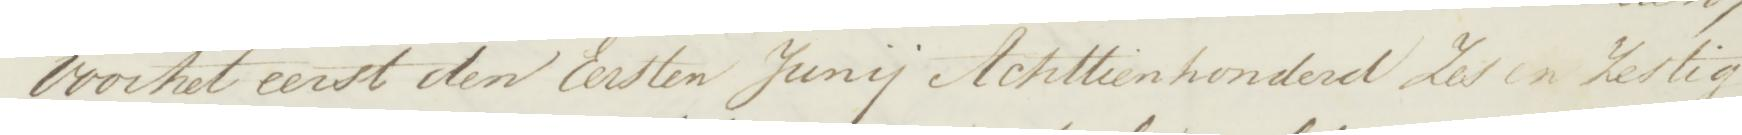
voor het eerst den Eersten Junij Achttienhonderd Zes en Zestig
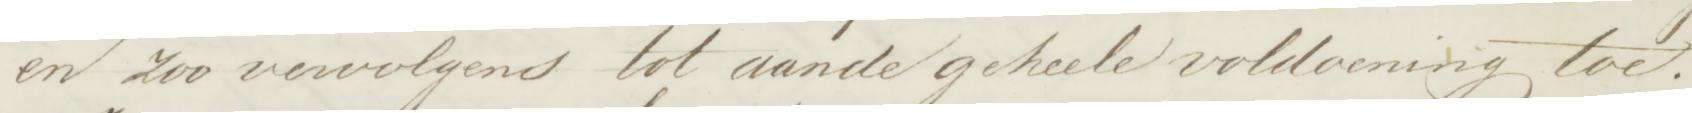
en zoo vervolgens tot aan de geheele voldoening toe„
